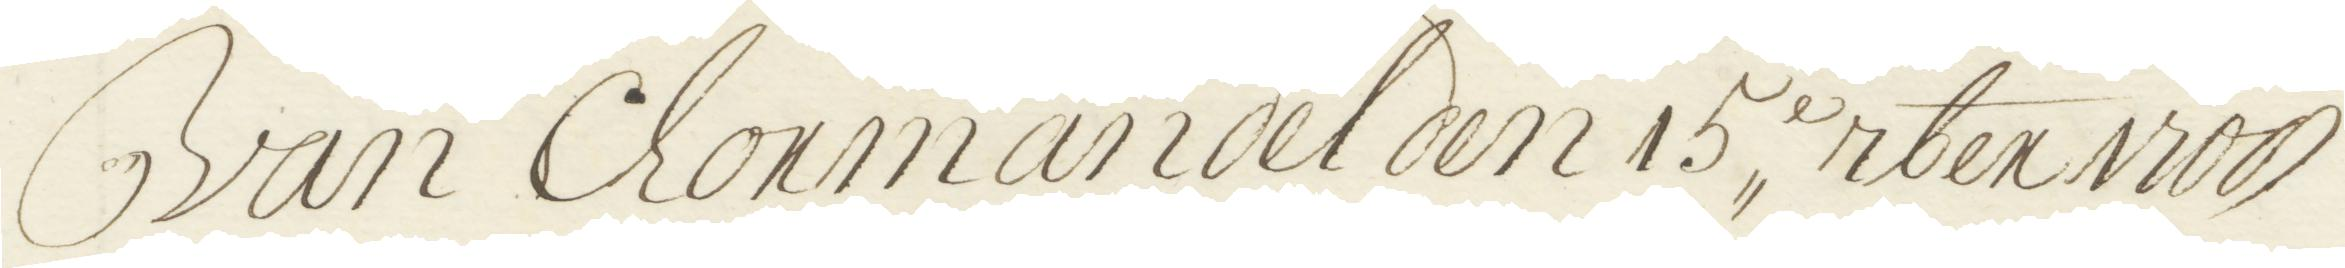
Van Chormandel den 15„e 7ber 1708
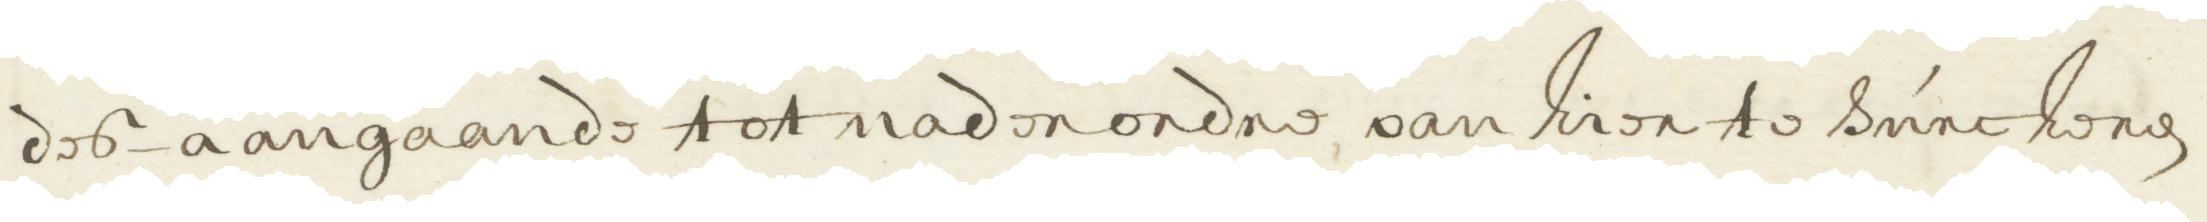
des aangaande tot nader ordre van hier te surcheren
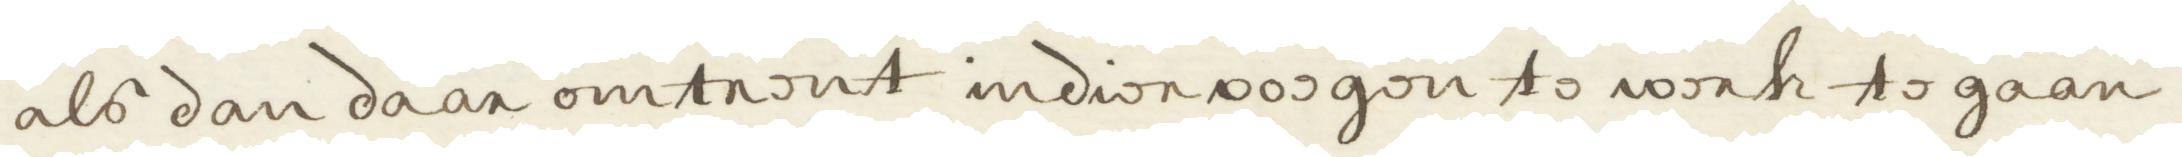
als dan daar omtrent indier voegen te werk te gaan
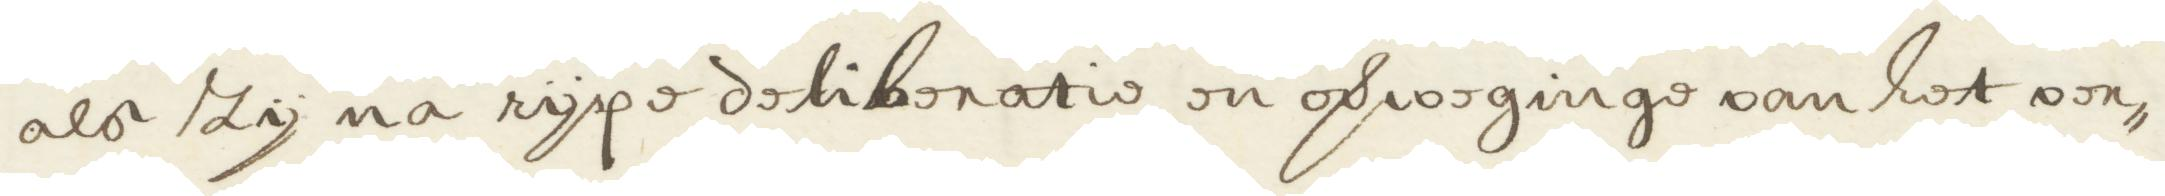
als zij na rijpe deliberatie, en overweginge van het ver„
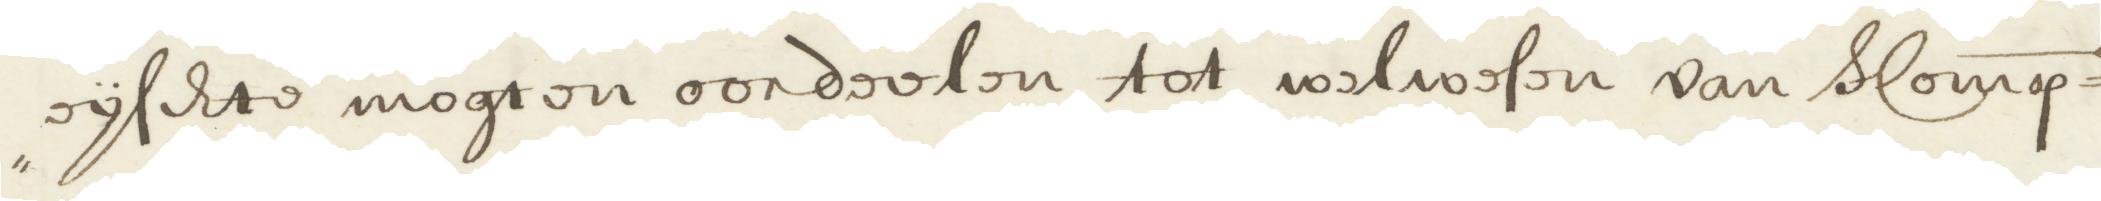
„eijschte mogten oordeelen, tot wel wesen van sComp=s
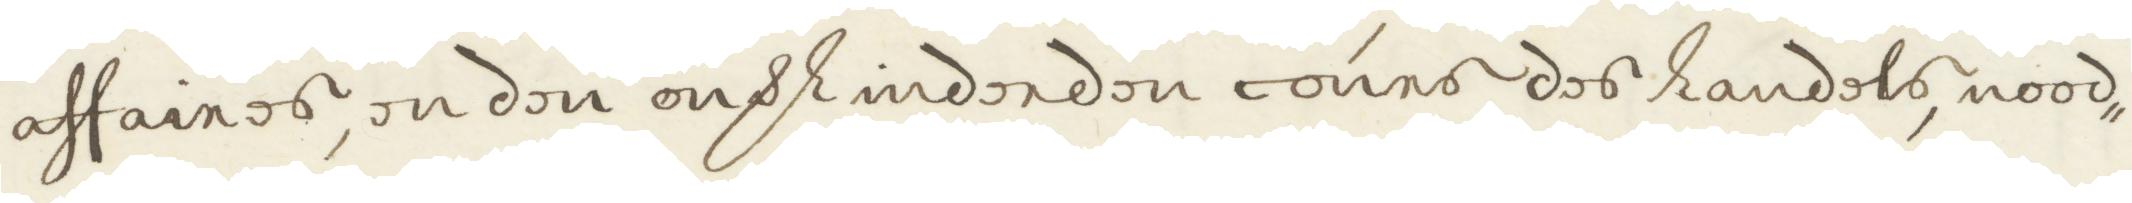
affaires, en den onverhinderden cours des handels, nood„
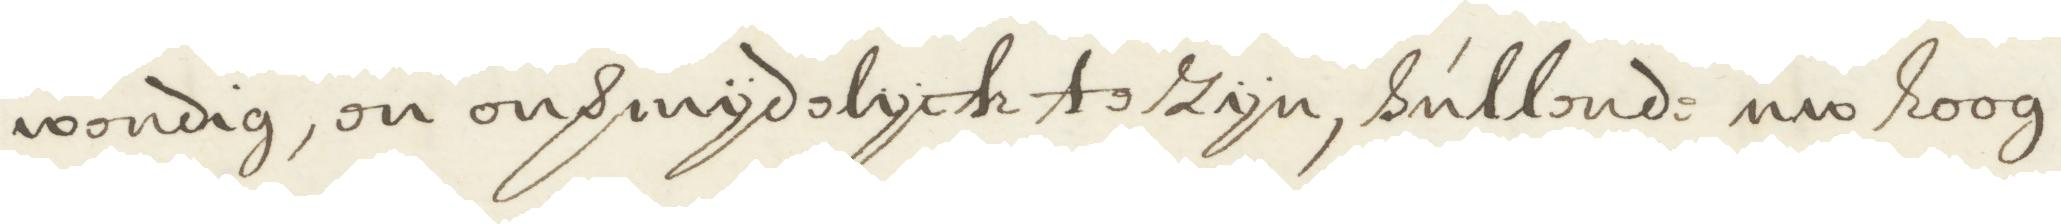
wendig, en onvermijdelijck te zijn, sullende uw hoog
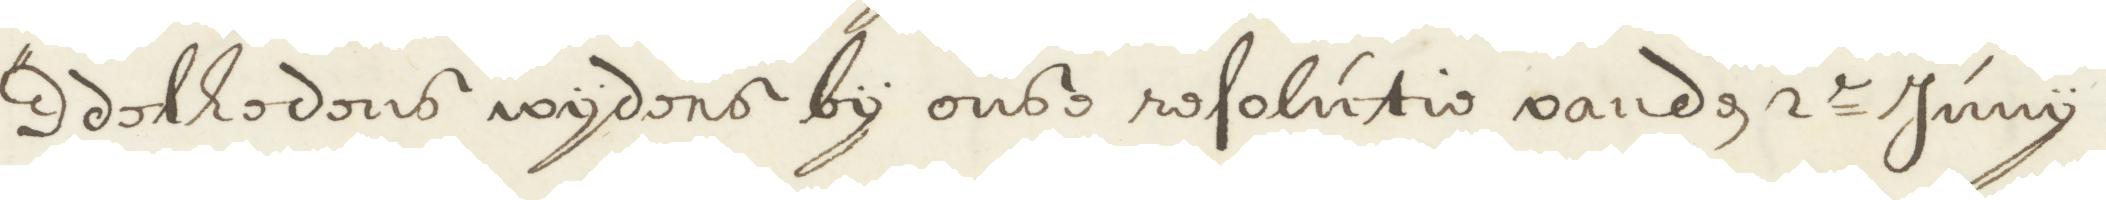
Edelhedens wijders bij onse resolutie vanden 2=e Junij
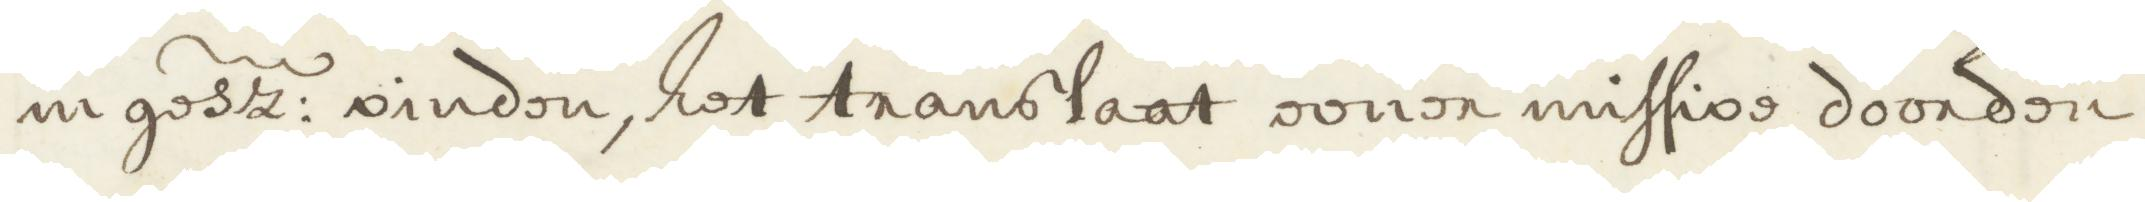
in gesz: vinden, het translaat eener missive, door den
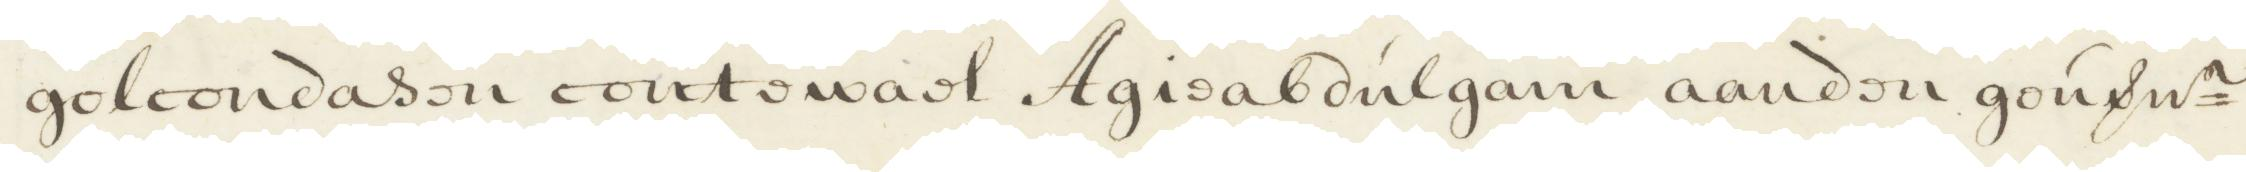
golcondasen coutewael Agie abdulgani, aan den gouvern=r
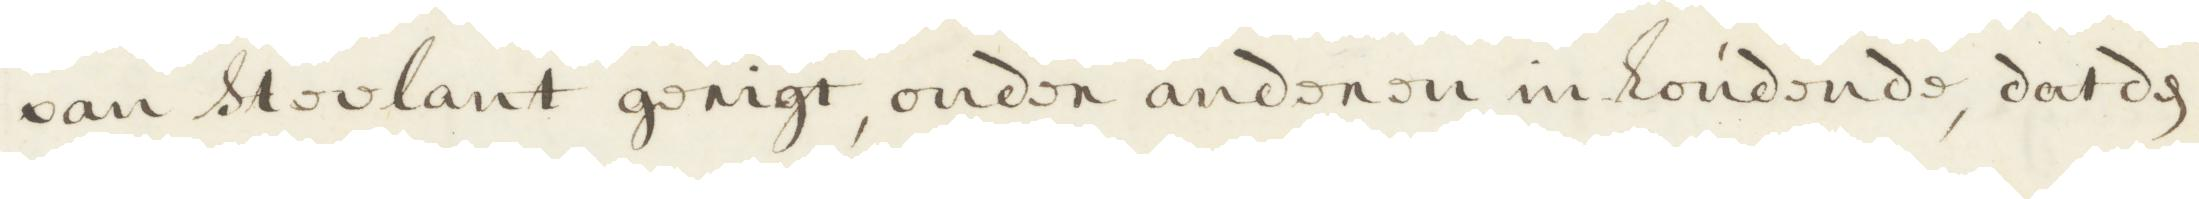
van steelant gerigt, onder anderen in houdende, dat den
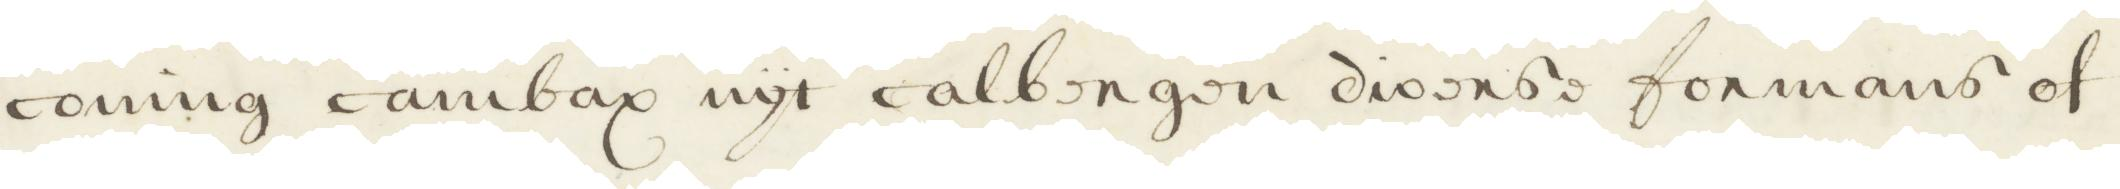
coning cambax uijt calbergen diverse formans of
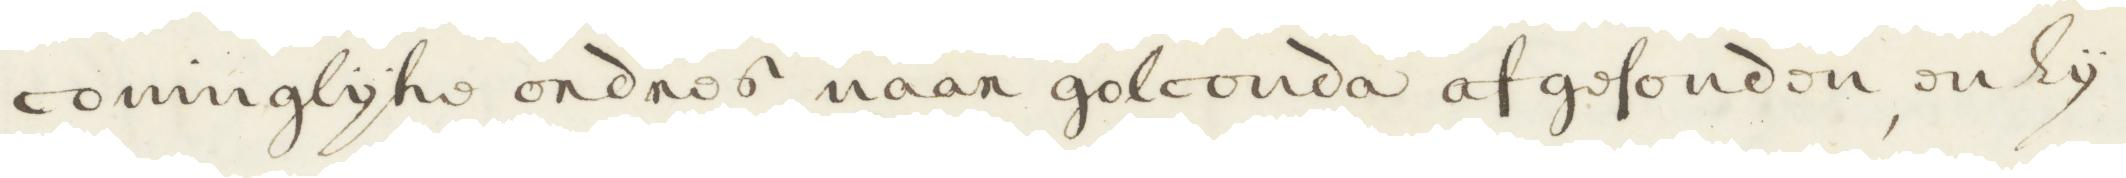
coninglijke ordres, naar golconda afgesonden, en hij
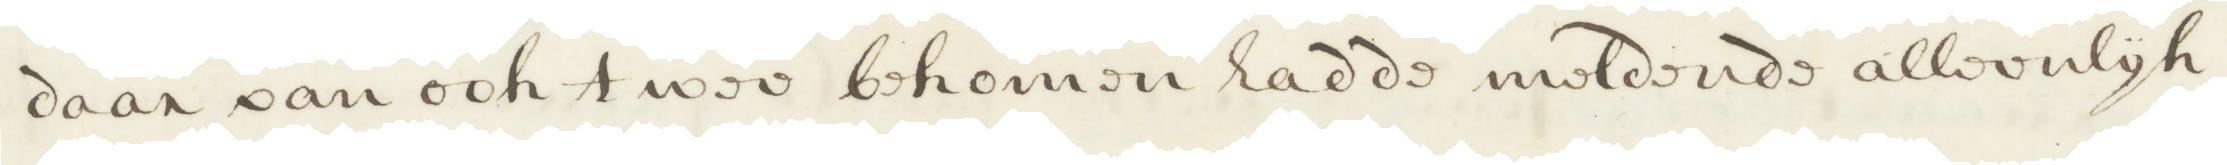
daar van ook twee bekomen hadde meldende alleenlijk
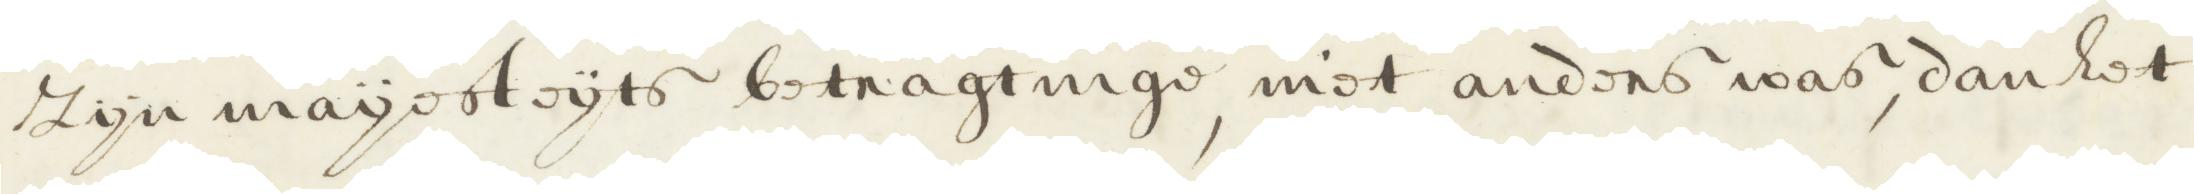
zijn maijesteijts betragtinge, niet anders was, dan het
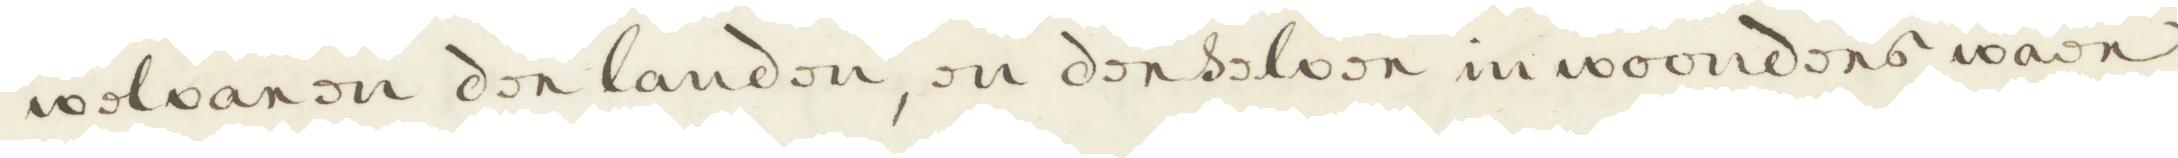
welvaren der landen, en derselver in woonders waer
